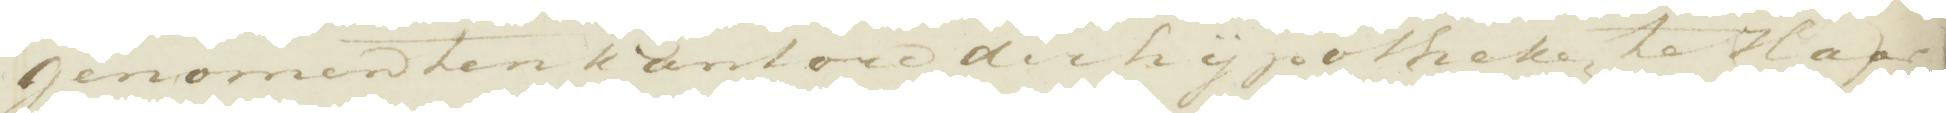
genomen ten kantore der hijpotheken, te Haar
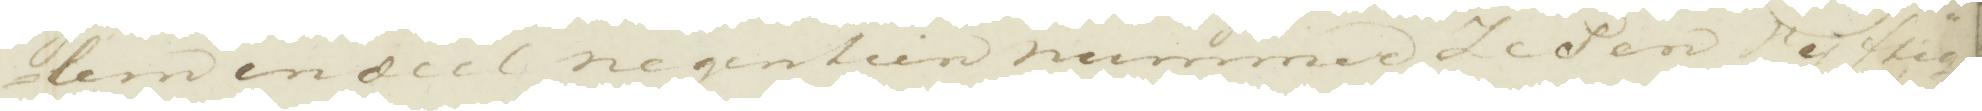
lem in deel negentien nummer Zesen Vijftig
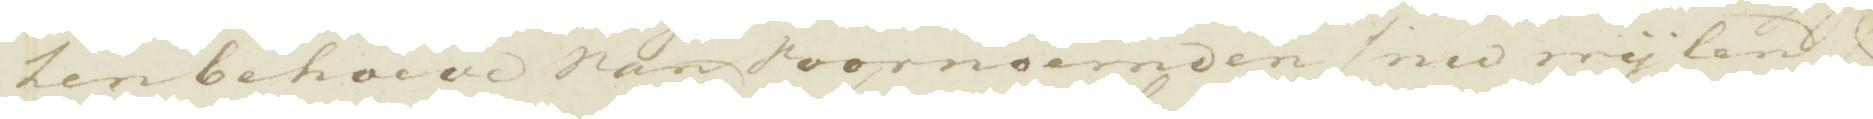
ten behoeve van voornoemden / nu wijlen /
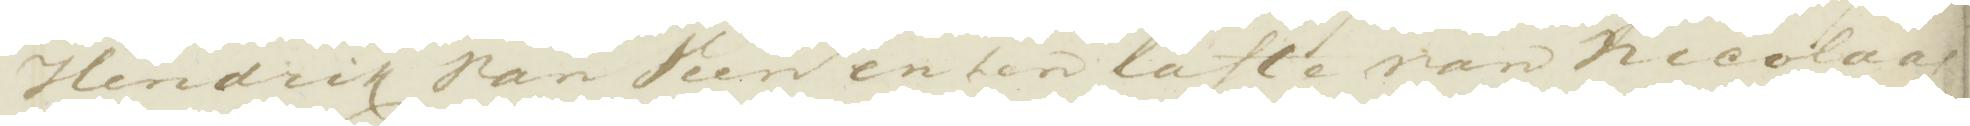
Hendrik van Veen en ten laste van Nicolaas
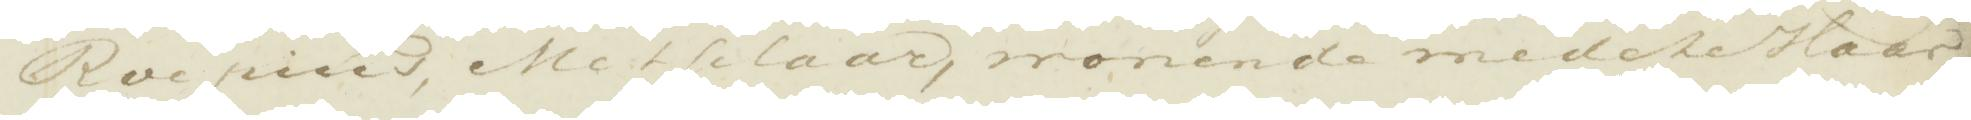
Roepius, Metselaar, wonende mede te Haar
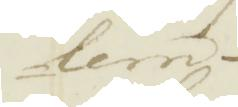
„lem
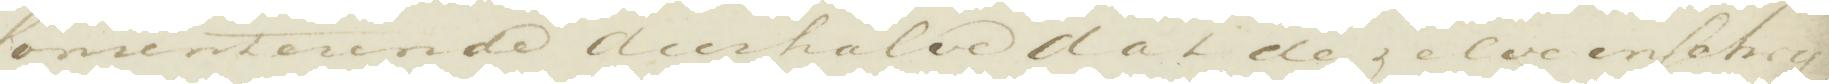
Consenterende dierhalve dat dezelve inschry
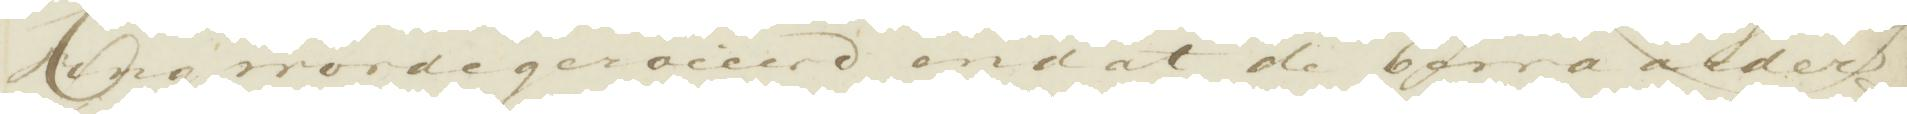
ving worde geroieerd en dat de bewaarders
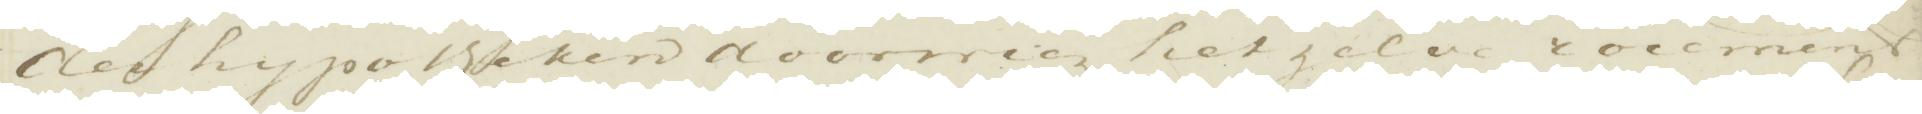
der hypotheken door wien het zelve roiement
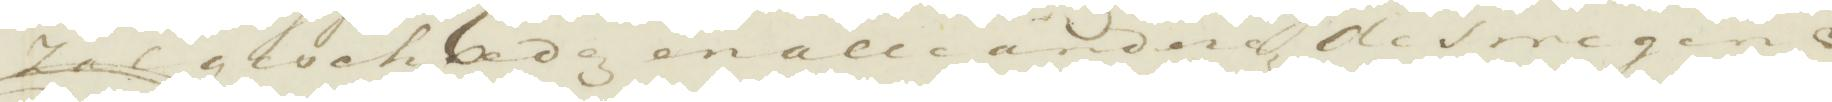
zal geschieden en alle anderen deswegens
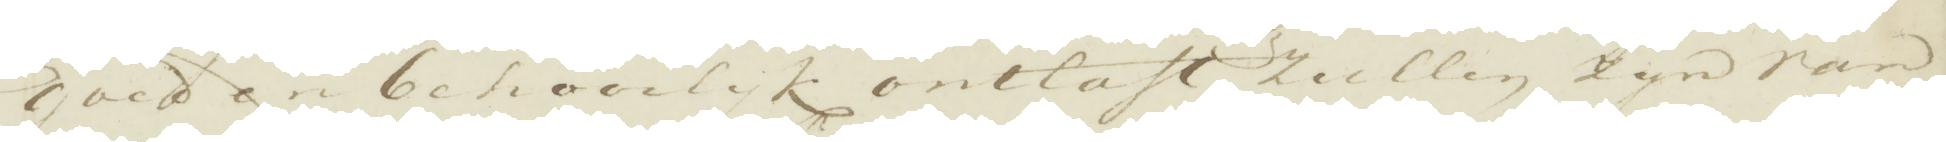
goeden behoorlijk ontlast zullen zijn van
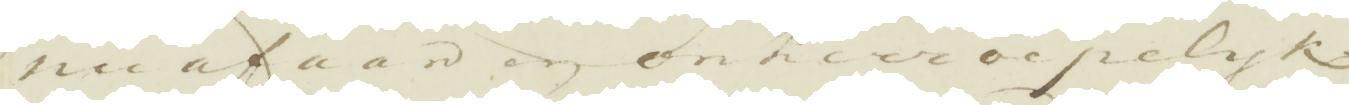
nu af aan en onherroepelyk
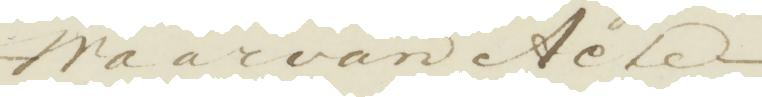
—Waarvan Acte—
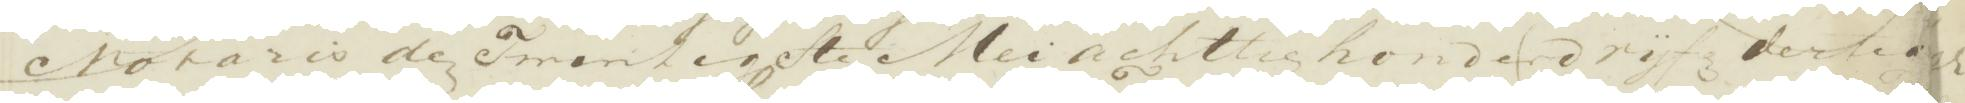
Notaris den Twintigste Mei achttien honderd vijf en dertig
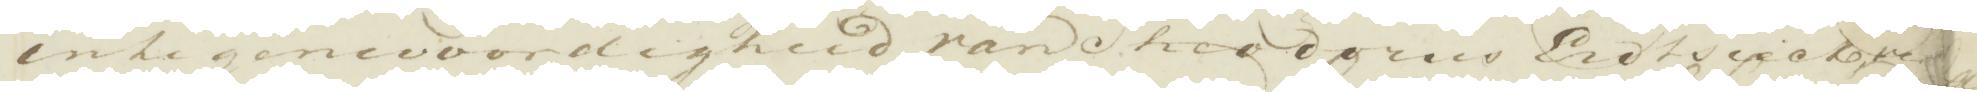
in tegenwoordigheid van Theodorus Erdtsieck, ver
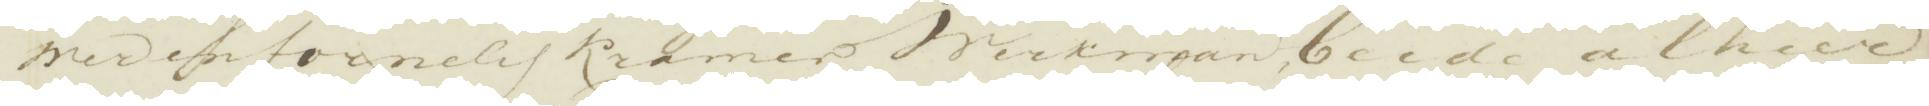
wer en Cornelis Kramer, Werkman, beide alhier
